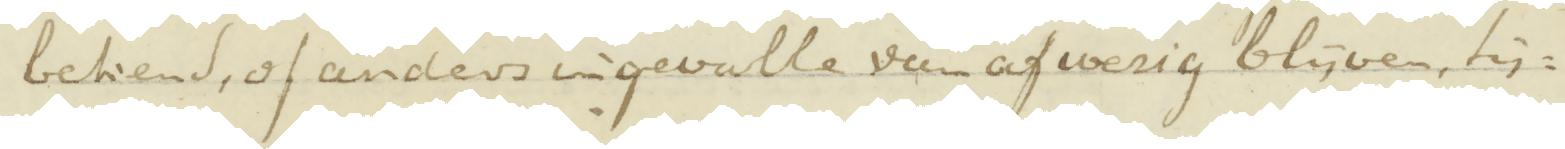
bekend, of anders in gevalle van afwezig blijven, tij=
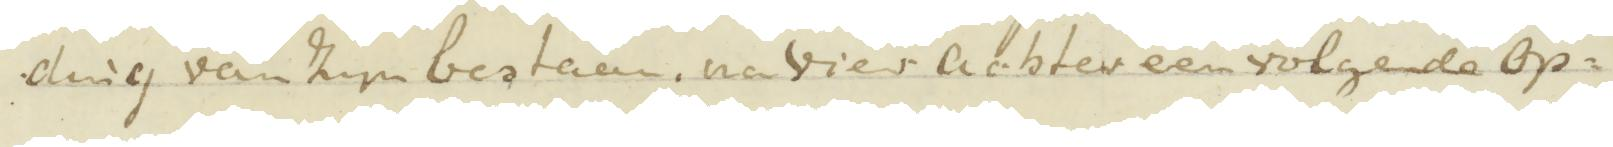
ding van zyn bestaan, na vier achter een volgende op=
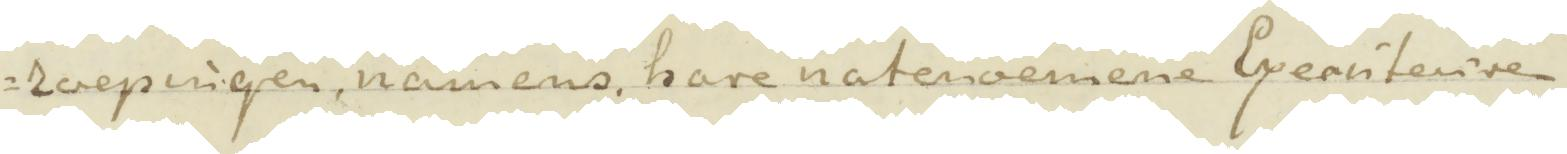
=roepingen, namens, hare natenoemene Executeure
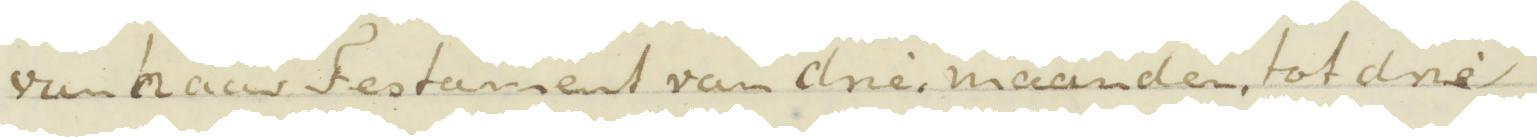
van haar Testament van drie maanden, tot drie
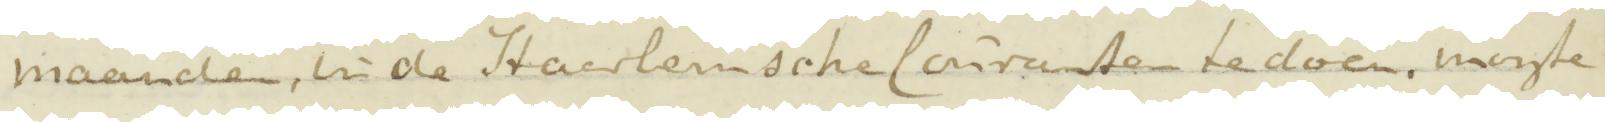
maanden, in de Haarlemsche Couranten te doen, mogte
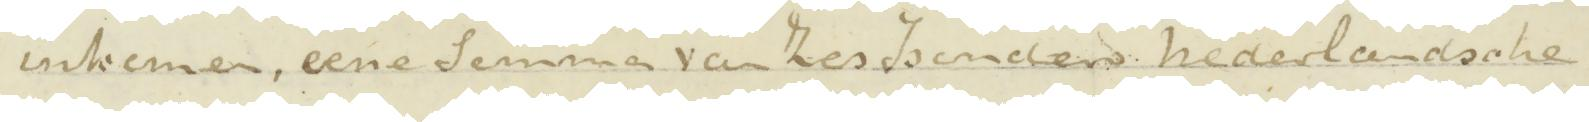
inkomen, eene somma van zes honderd nederlandsche
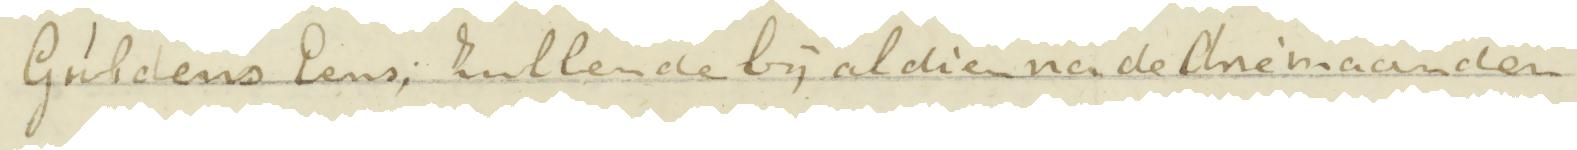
Guldens Eens; zullende bij aldien na de drie maanden
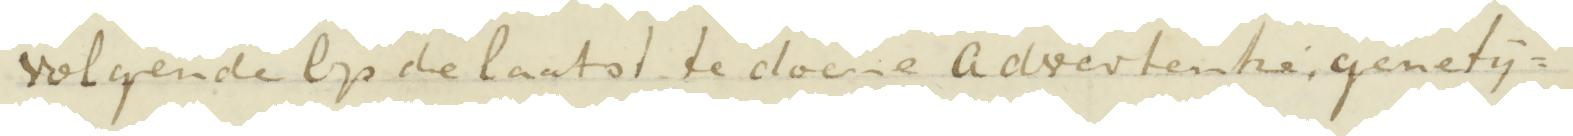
volgende op de laatst te doene Advertentie gene tij=
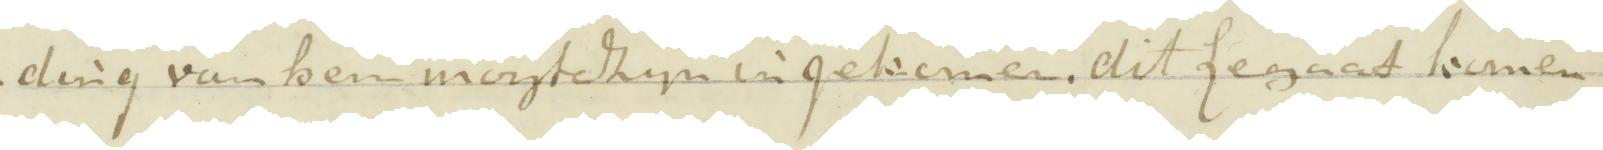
ding van hen mogte zijn ingekomen, dit Legaat komen
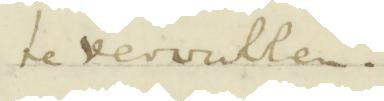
te vervallen.
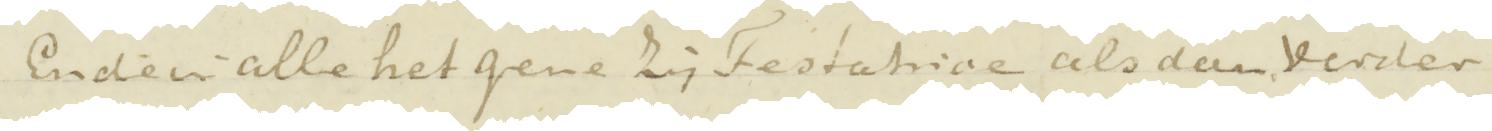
Indien alle het gene zij Testatrice als dan verder
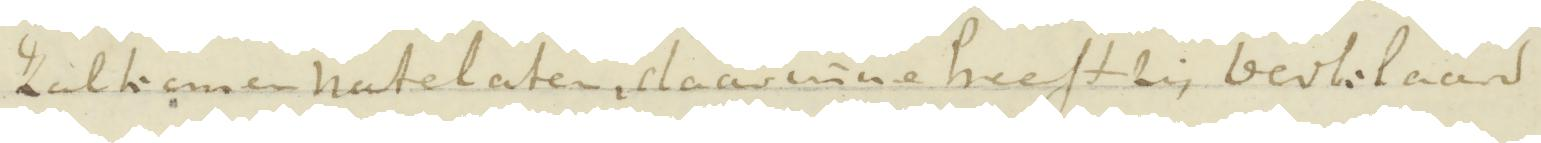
zal komen natelaten, daarinne heeft zij verklaard
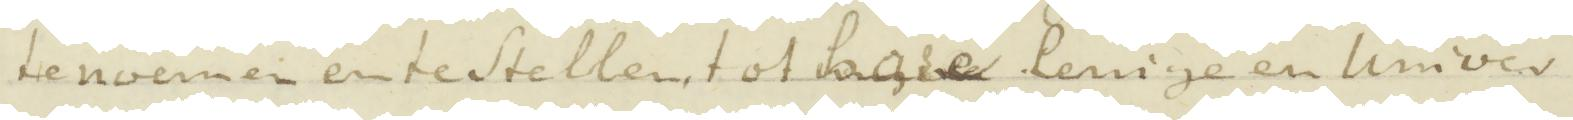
te noemen en te stellen, tot hare Eenige en univer
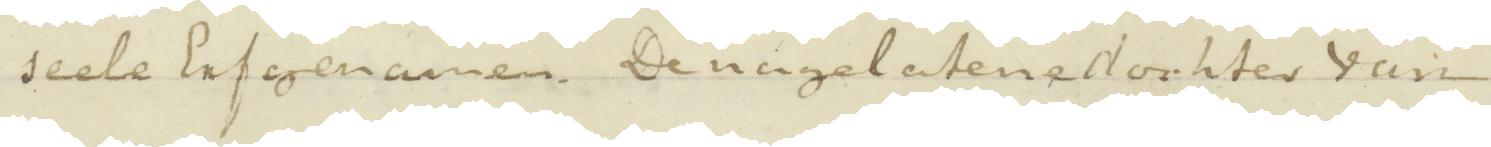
seele Erfgenamen. De nagelatene dochter van
